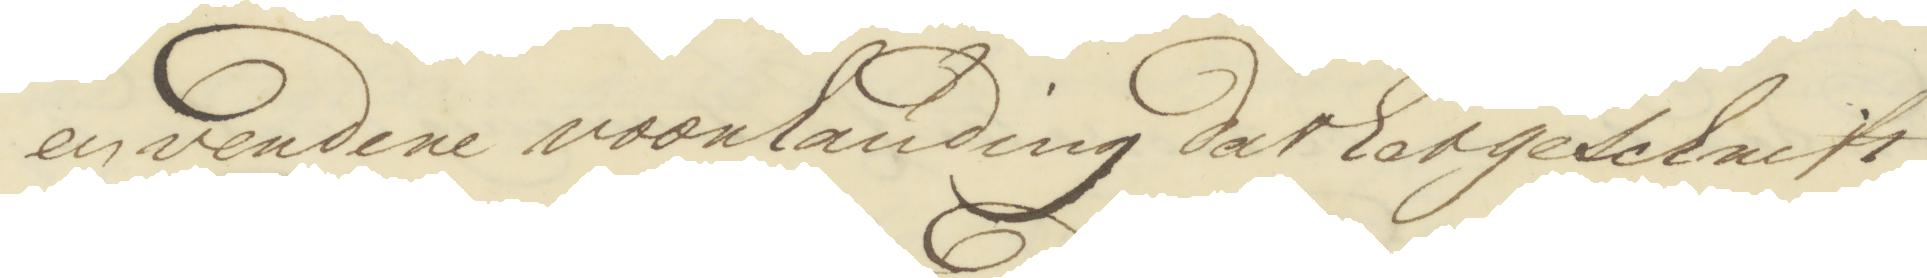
en verdere voorhouding dat het geschrift
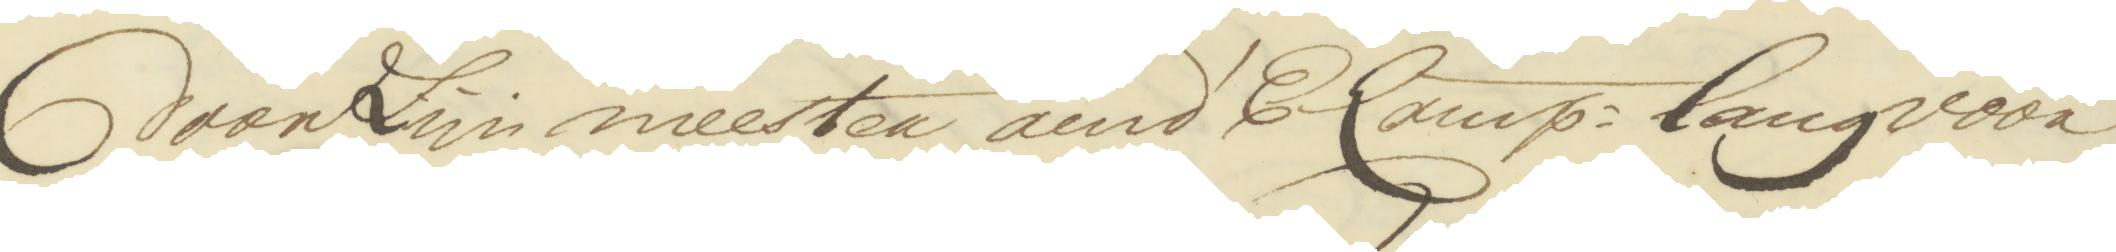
door zijn meester aen d'E Comp: lang voor
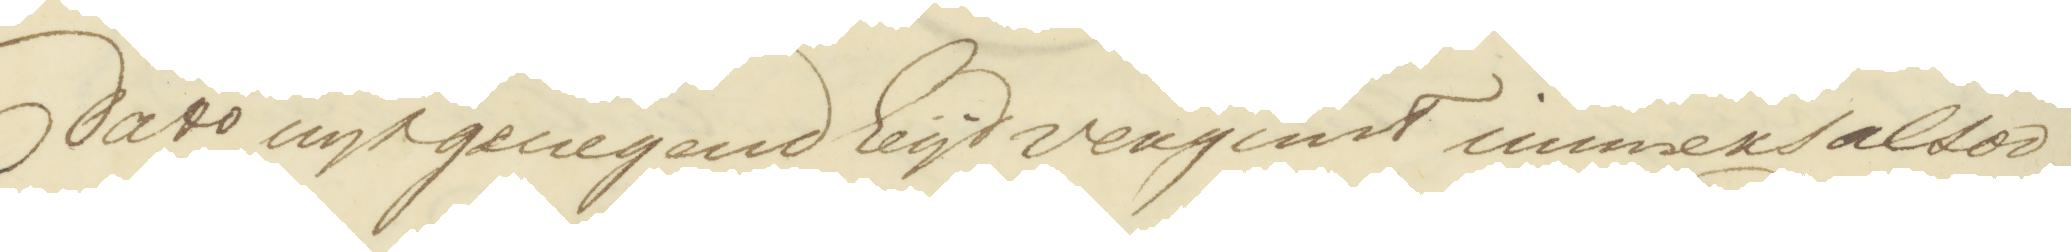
dato uijt genegend heijd vergunt immers alsoo
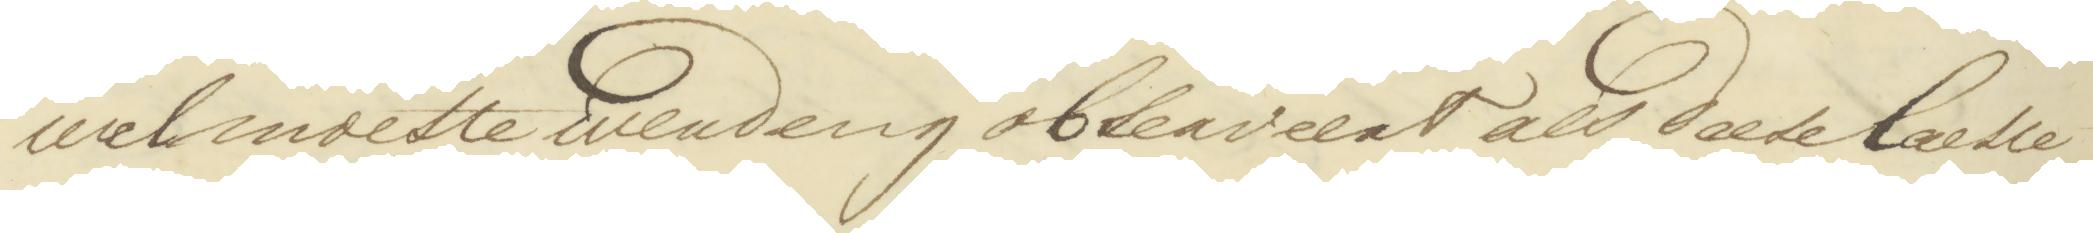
wel moeste werden g'observeert als deese laeste
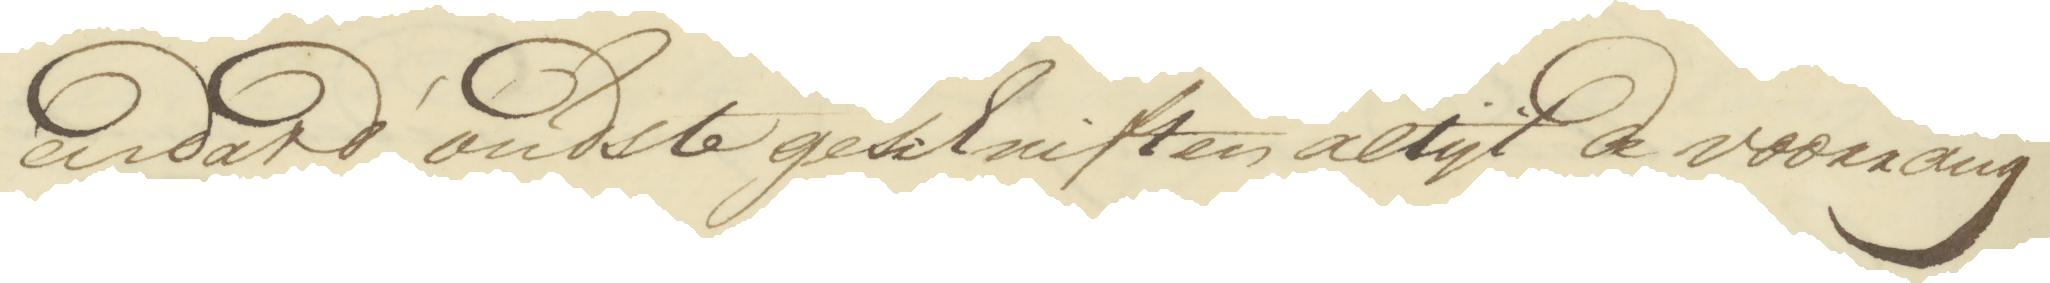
en dat d' oudste geschriften altijt de voorrang
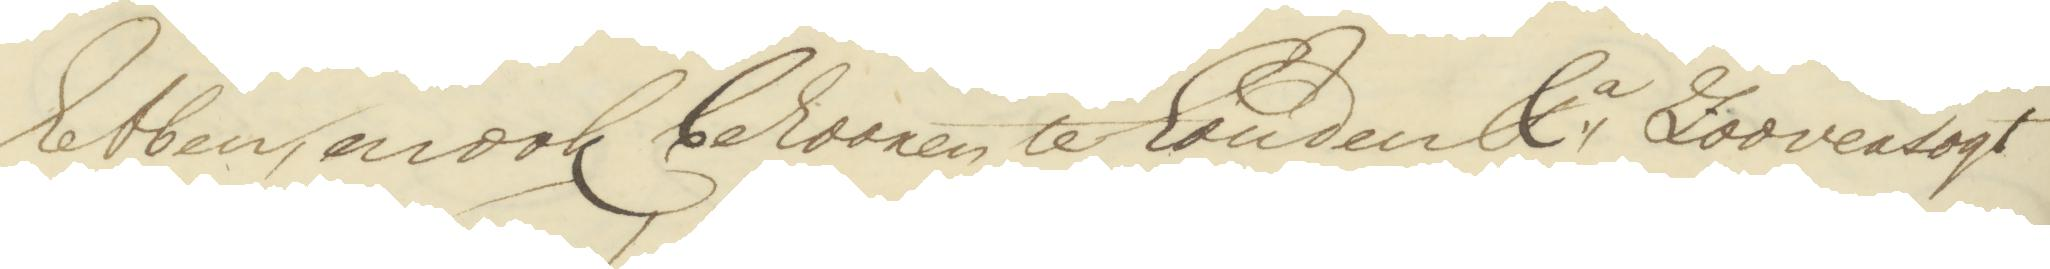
hebben, en ook behooren te houden &„a zoo versogt
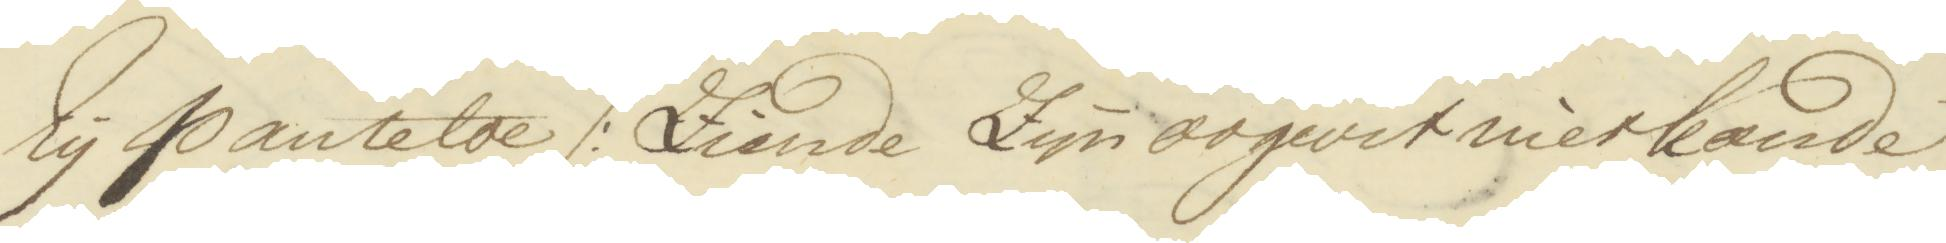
hij panteloe /: ziende zijn oogwit niet konde
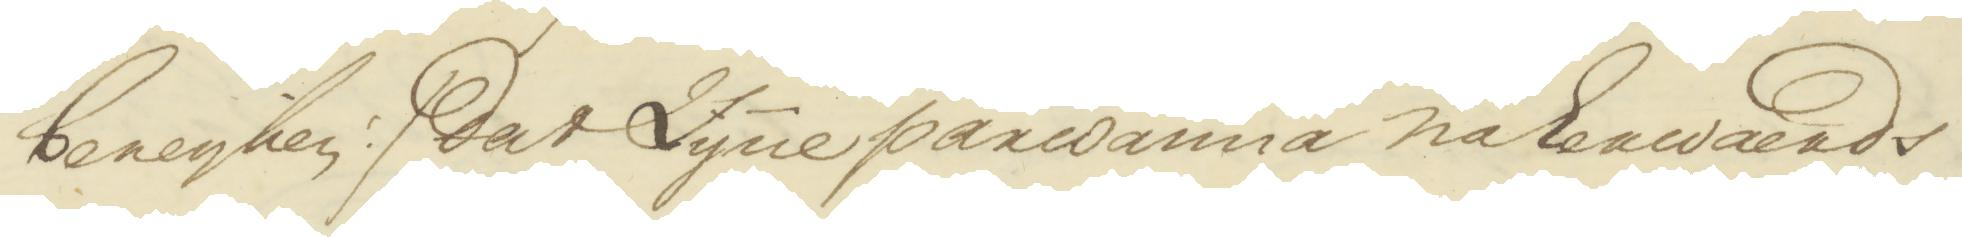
bereijken :/ dat zijne parwanna na herwaerds
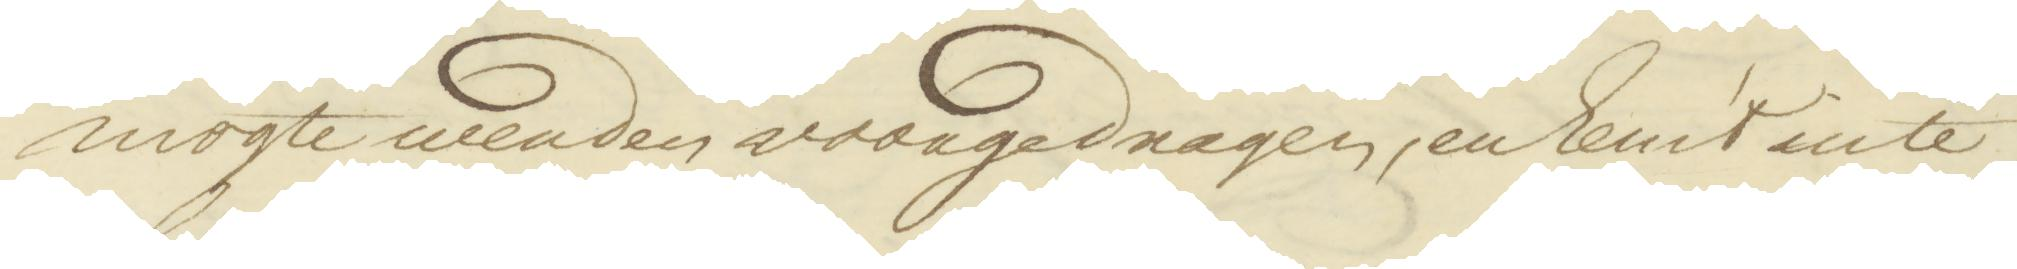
mogte werden voorgedragen, en hem't in te
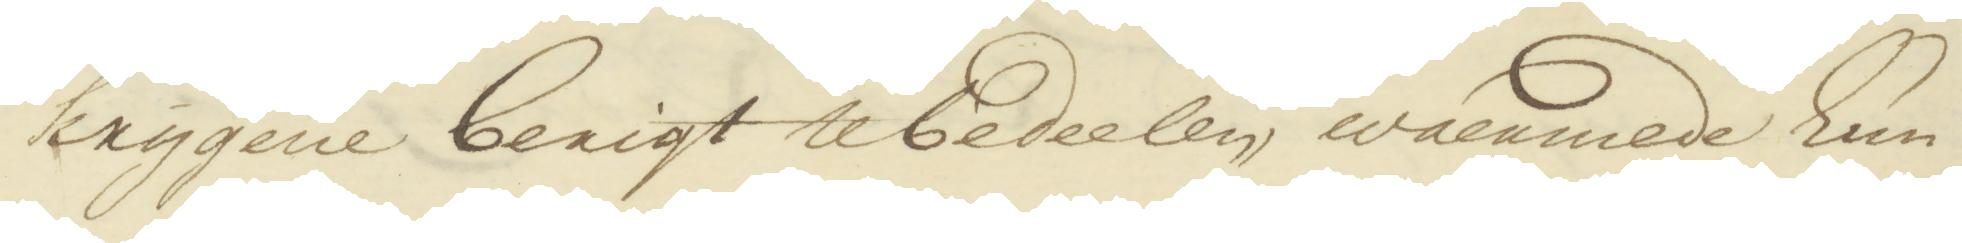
krijgene berigt te bedeelen, waermede hun
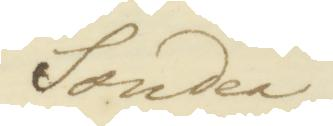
sonder
